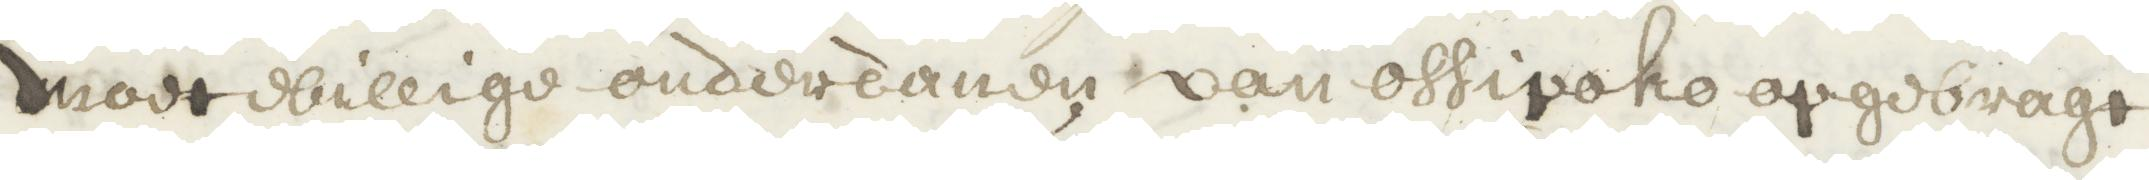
moetwillige onderdanen van ossipoko opgebragt
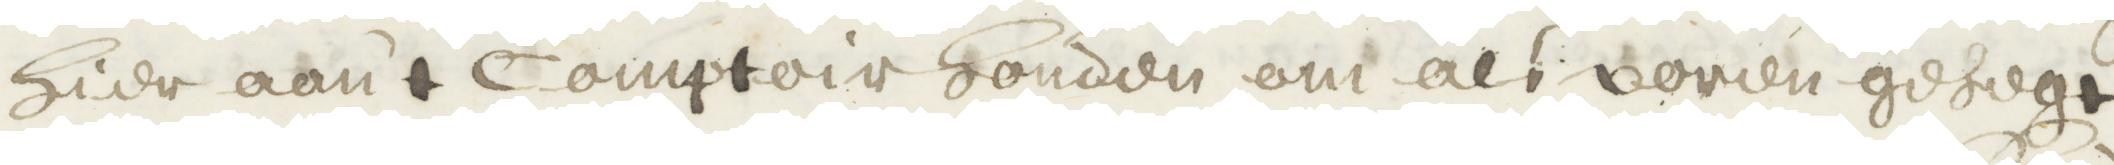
hier aan ’t comptoir houden om als voren gesegt
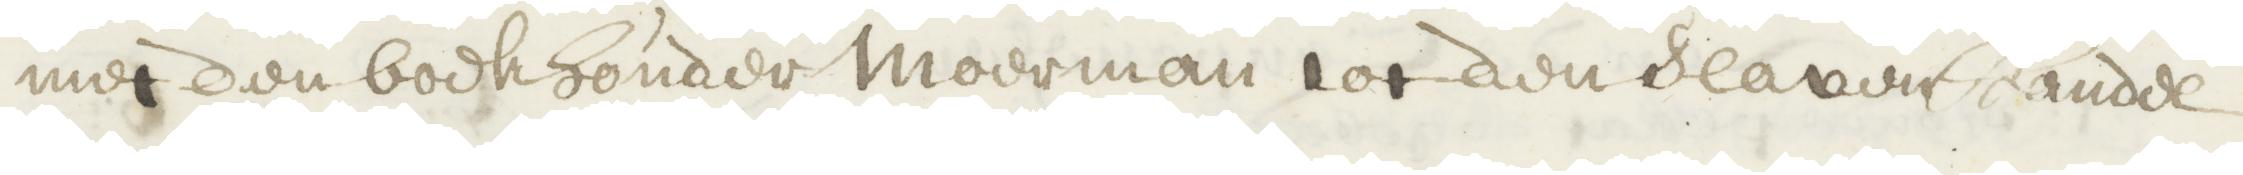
met den boekhouder Moerman tot den slavenhandel
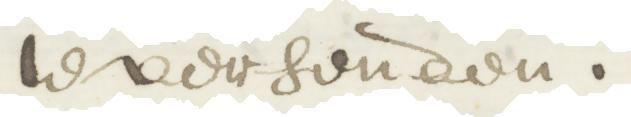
te versenden.
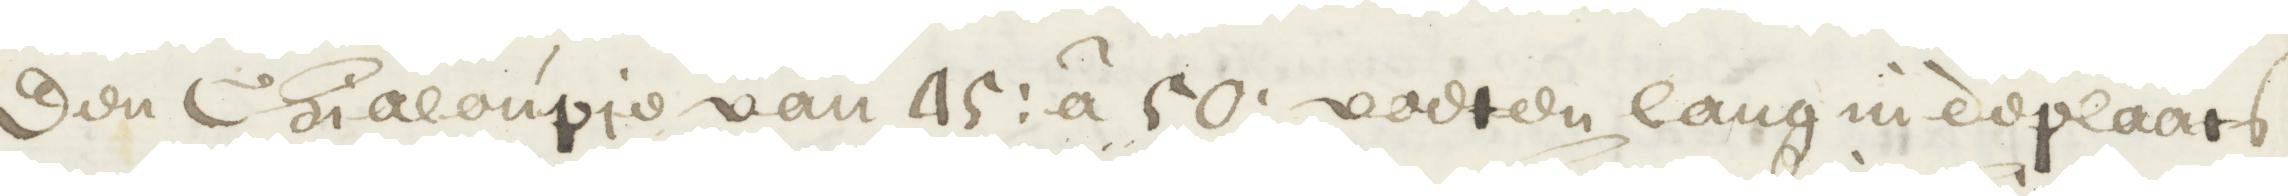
Een Chialoupje van 45: â 50: voeten lang in de plaats
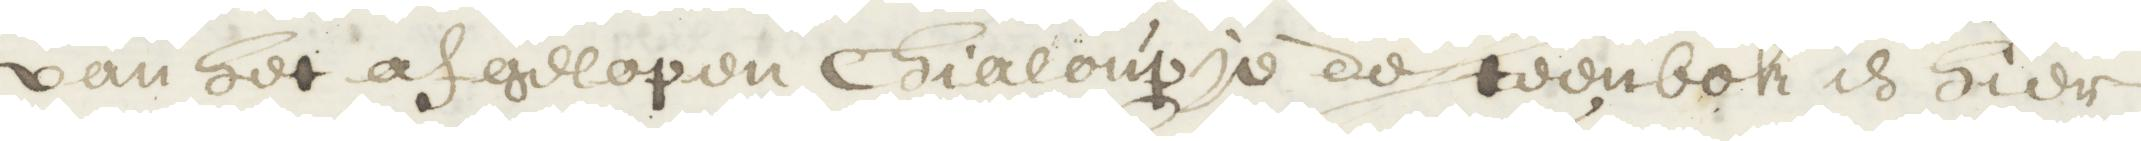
van het afgelopen Chialoupje de Steenbok is hier
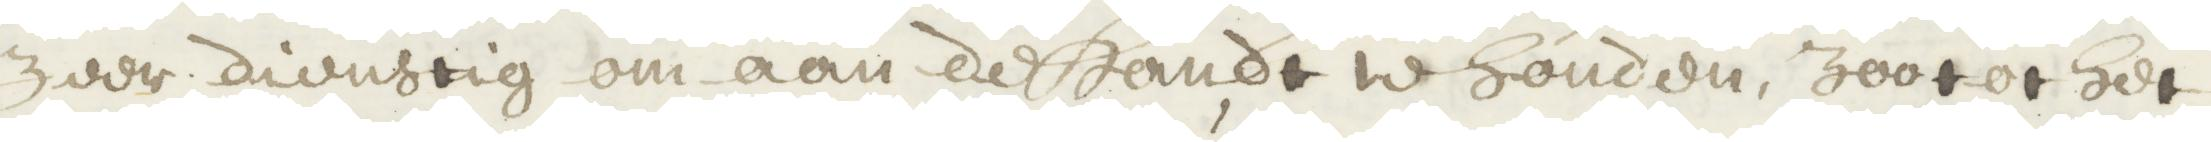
zeer dienstig om aan deHandt tehouden, zoo tot het
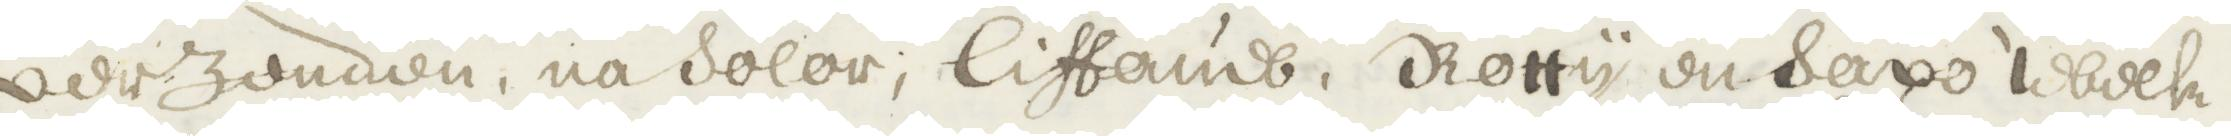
verzenden, na Solor; Liffauw: Rottij en Savo 'twelk
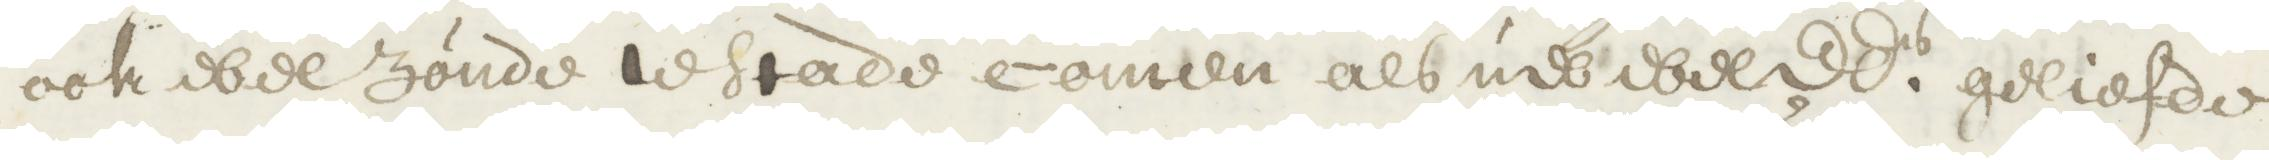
ook wel zoude testade comen als uw welEd:es geliefde
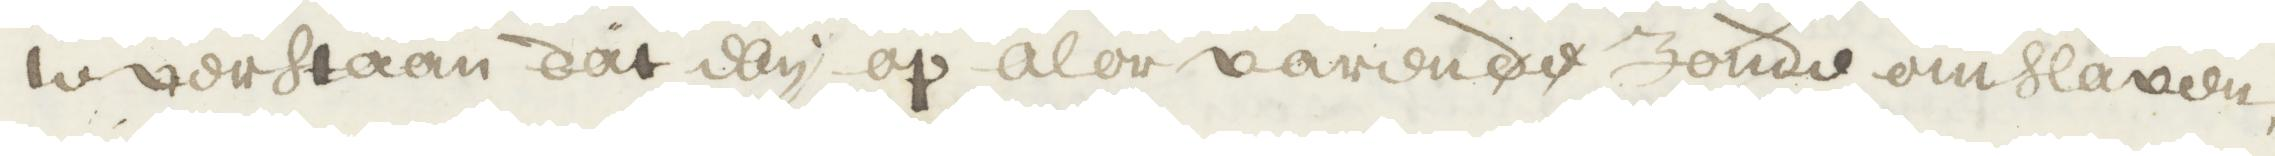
te verstaan dat wij op alor varende zoude om slaven
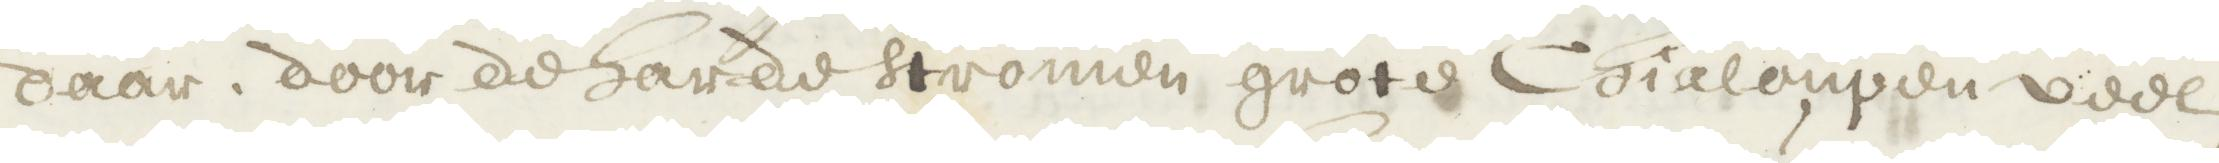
daar, door deharde stromen grote Chialoupen veel
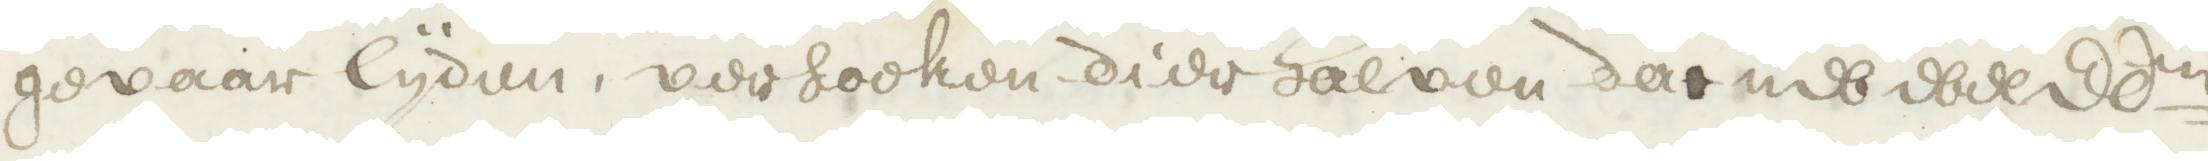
gevaar lijden, versoeken dierhalven dat uw welEd=en
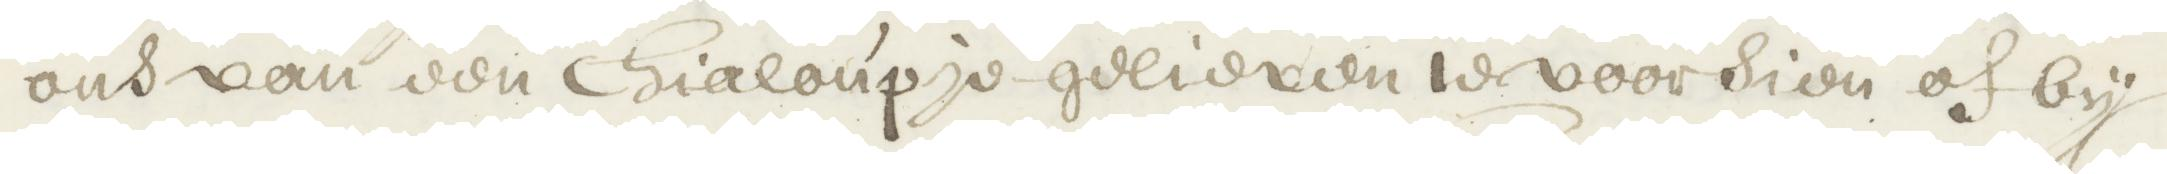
ons van een chialoupje gelieven te voorsien of bij
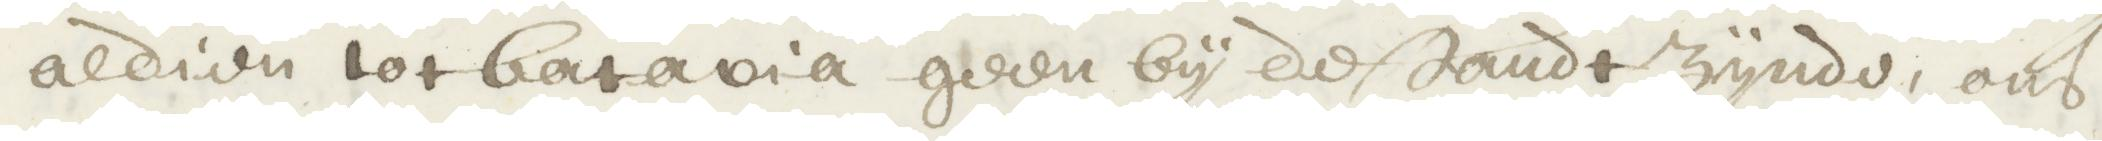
aldien tot batavia geen bij de handt zijnde, ons
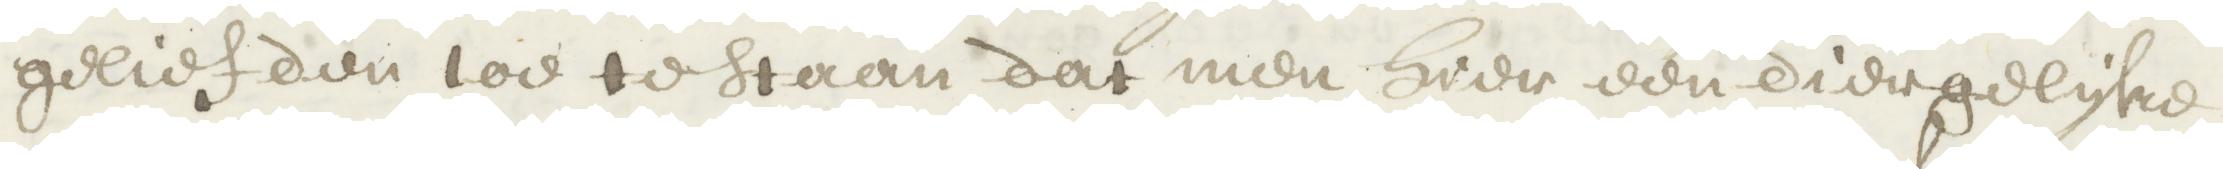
geliefden toe te staan dat men hier een diergelijke
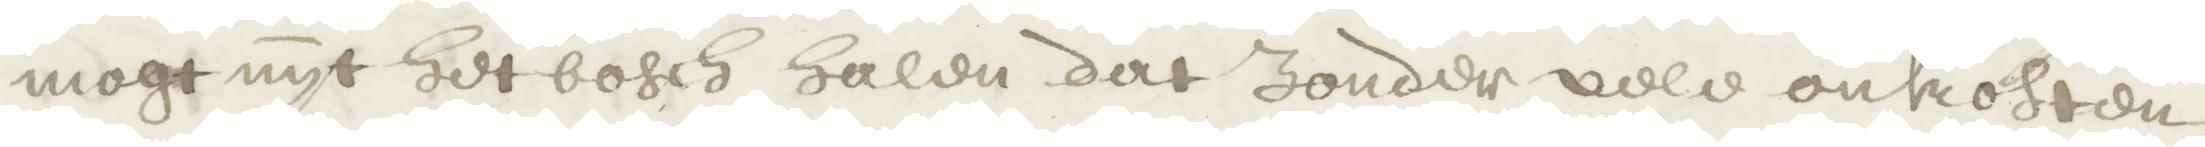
mogt uijt het bosch halen dat zonder vele onkosten
